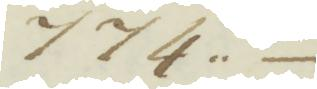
774 „ —
